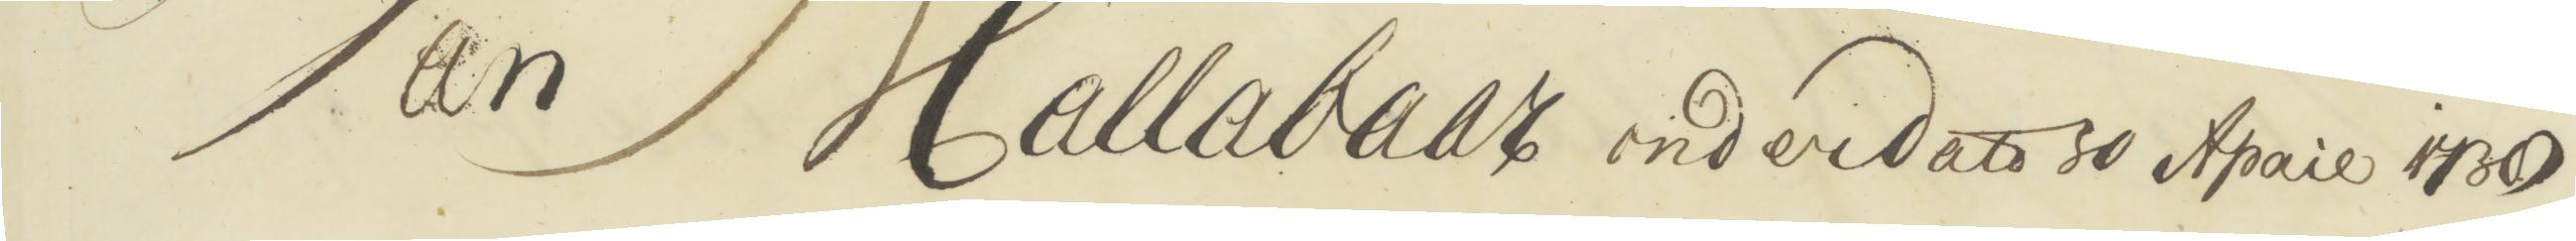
Van Mallabaar onderdato 30 April 1738
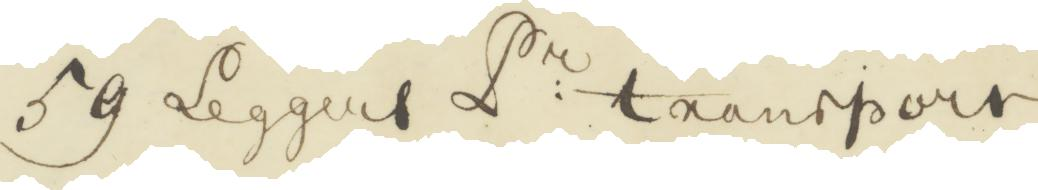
59 Leggers P:r transport
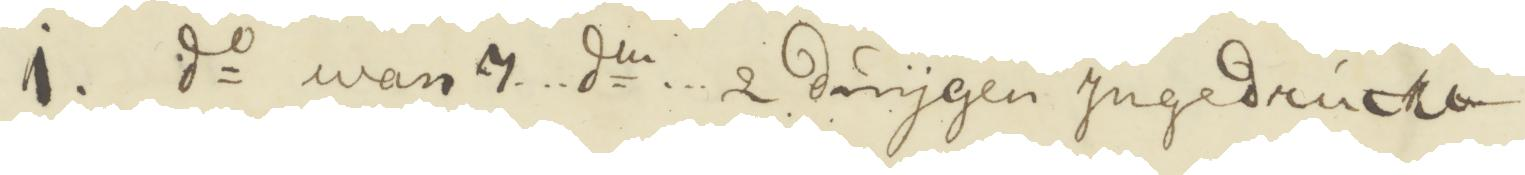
1. d=o wan 7... d=m ... 2 duijgen Jngedruckt
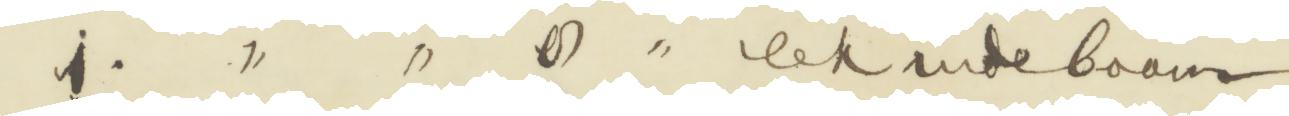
1. „ „ 8 „ lek inde boom
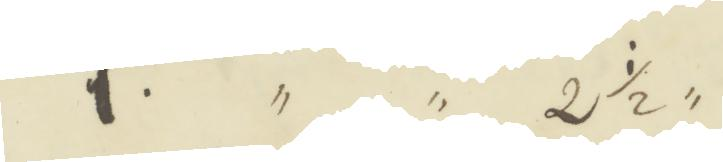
1. „ „ 2½ „
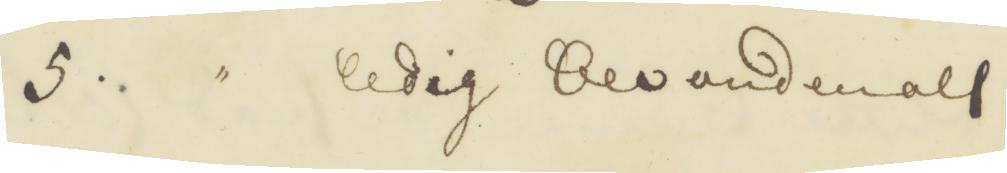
5. „ ledig bevonden als
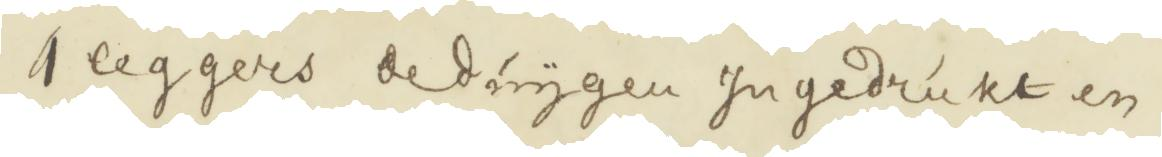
4 leggers de duijgen Jngedrukt en
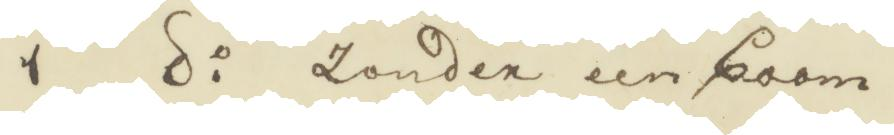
1 d.o zonder een boom
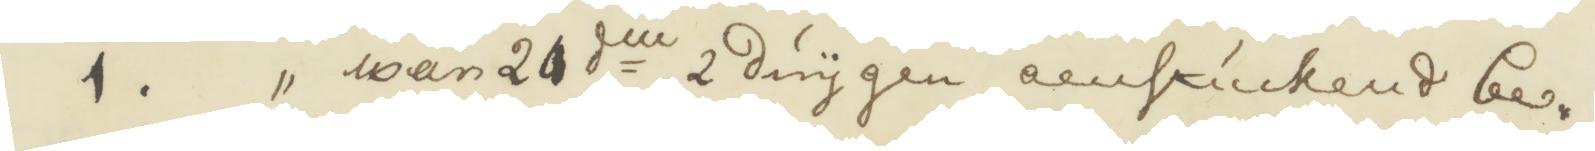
1. „ wan 24 d=m 2 duijgen aenstuckend be„
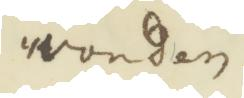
„vonden
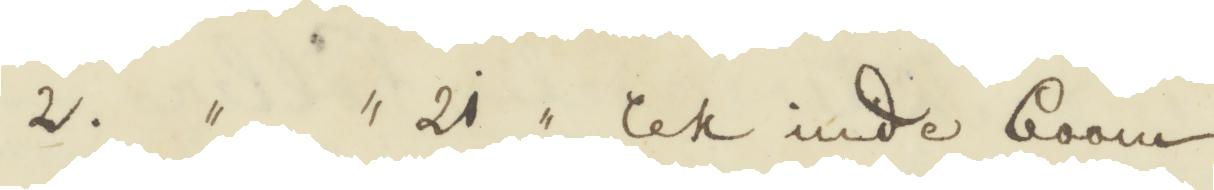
2. „ „ 21 „ lek inde boom
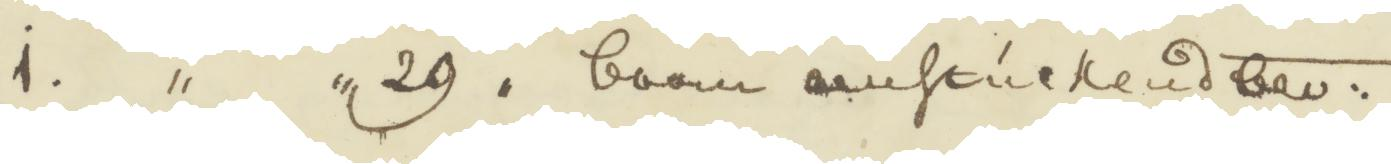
1. „ „ 29 „ boom aenstuckend bev:
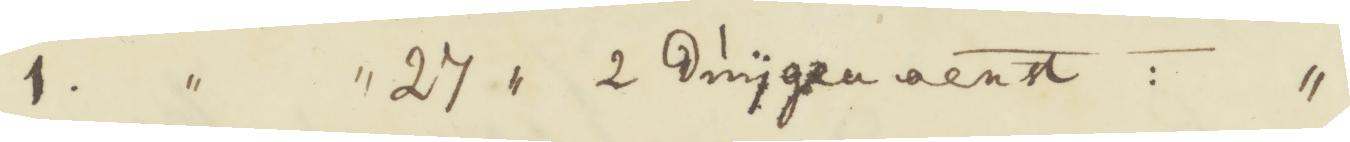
1. „ „ 27 „ 2 duijgen aen st: „
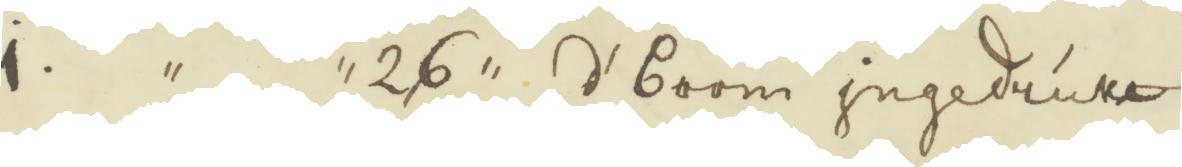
1. „ „ 26 „ d’ boom jngedrukt
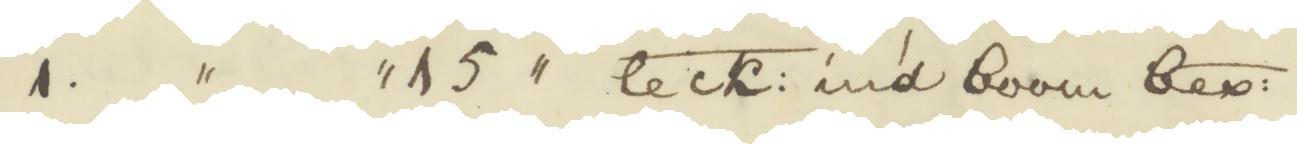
1. „ „ 15 „ leck: ind boom bev:
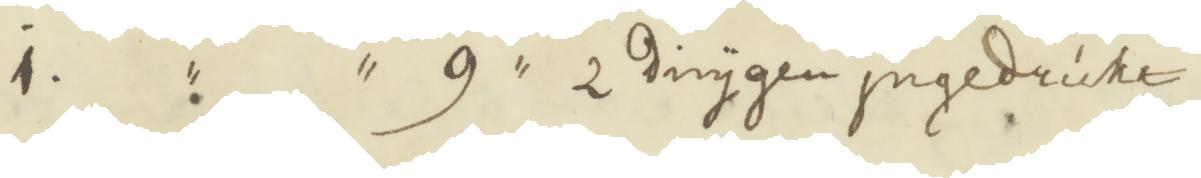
1. „ „ 9 „ 2 duijgen jngedrukt
